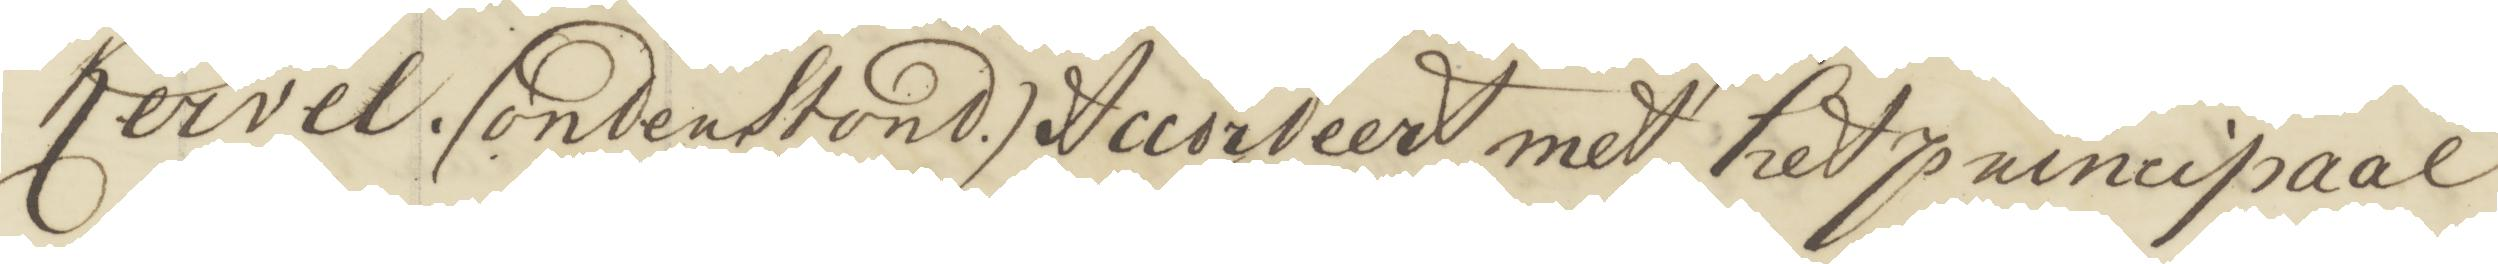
Kervel. (onderstond.) Accordeert met het principaal
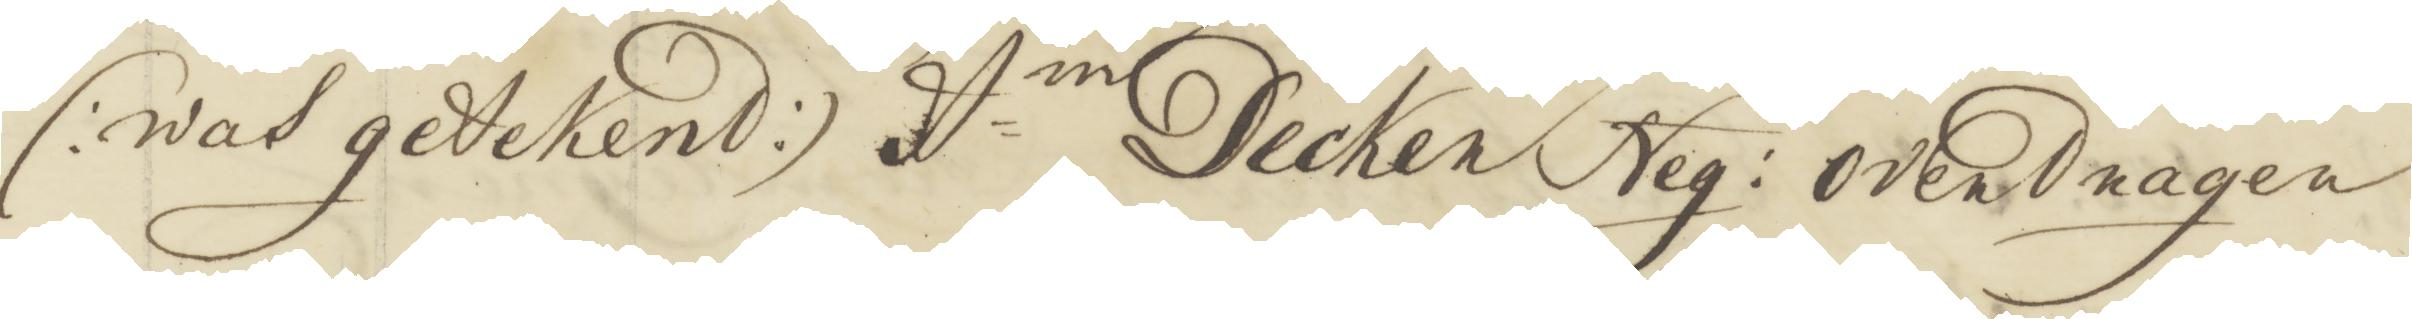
(:was getekend:) A„m Decker Neg: overdrager
